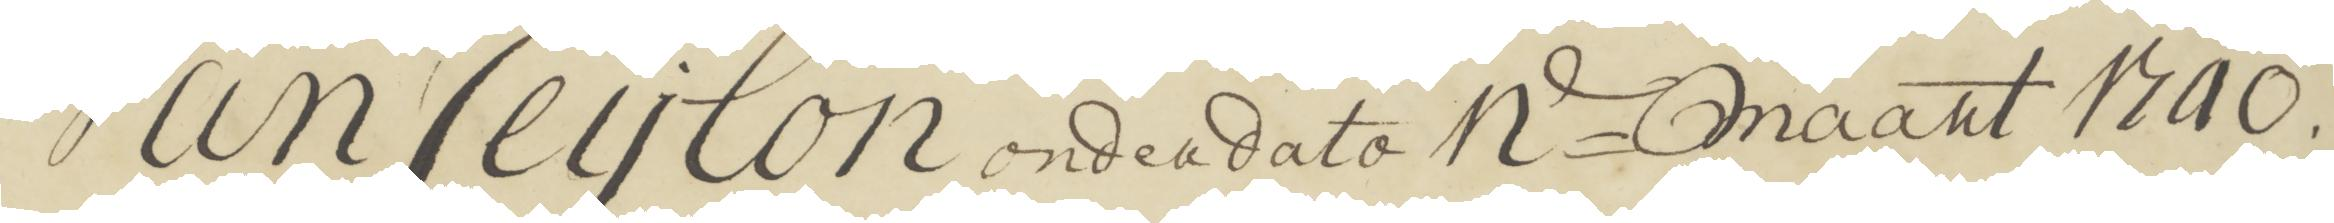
Van Ceijlon onder dato 12=e Maart 1740.
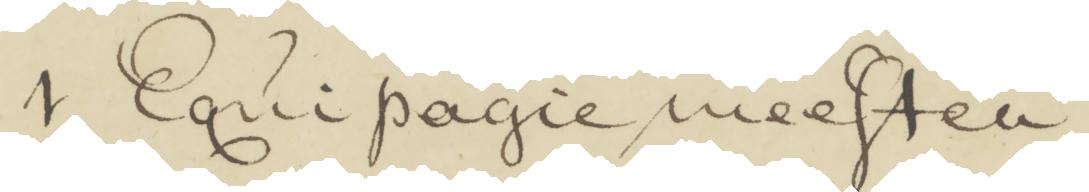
1 Equipagie meester
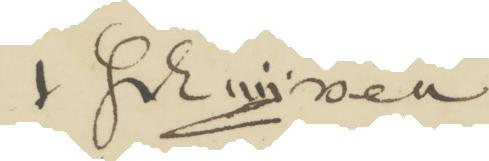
1 schrijver
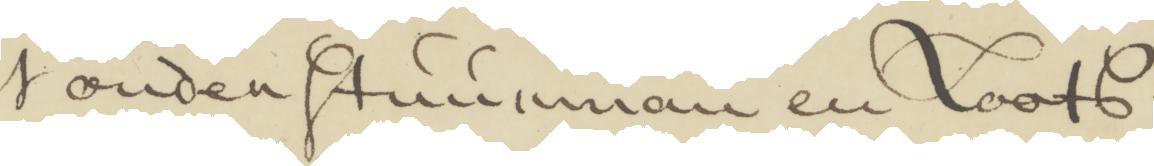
1 onderstuurman en Loots
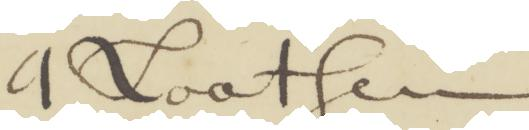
4 Lootsen
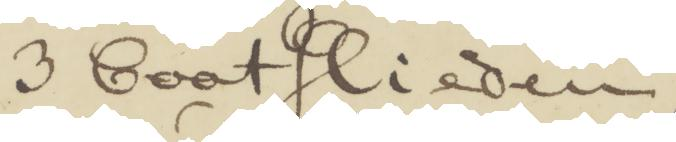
3 bootslieden
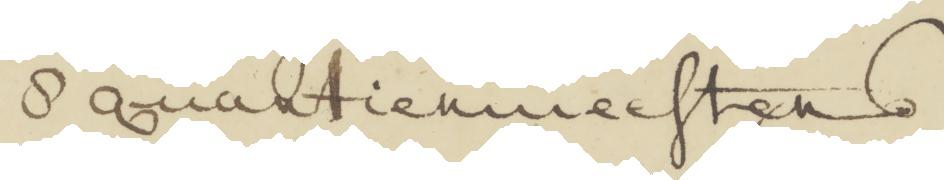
8 quartiermeesters
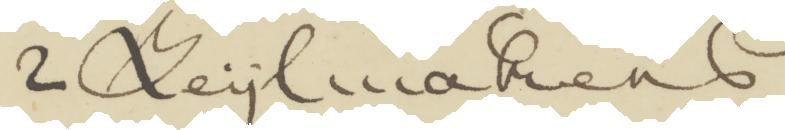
2 Zeijlmakers
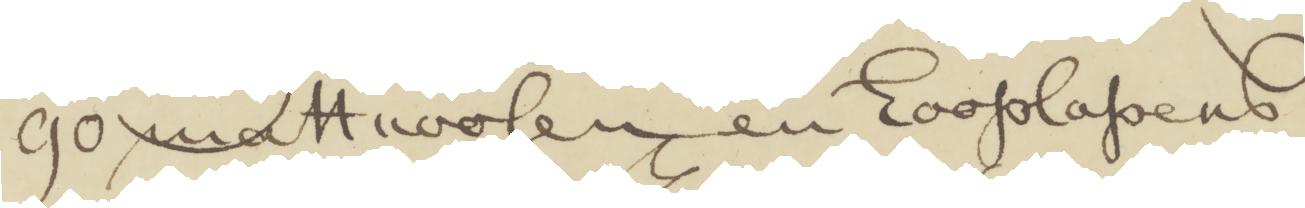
90 mattroosen en hooplopers
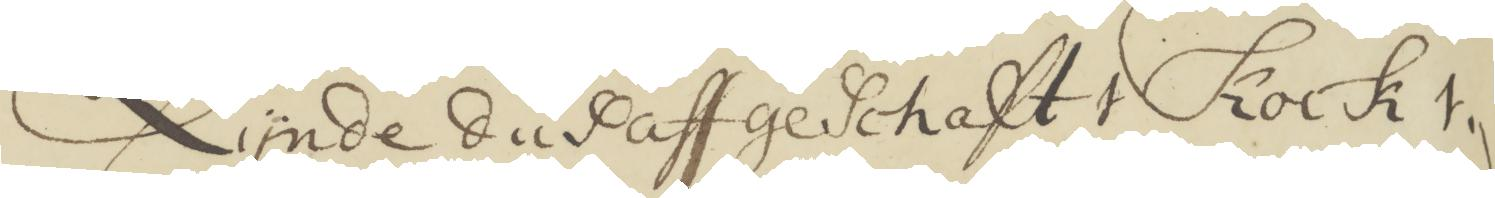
Zijnde dus affgeschaft t Kock 1.
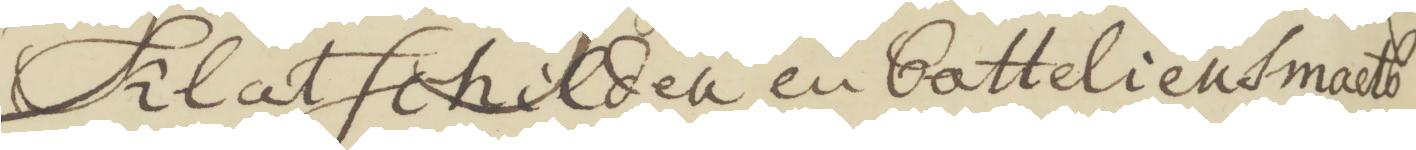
klatschilder en batteliersmaets
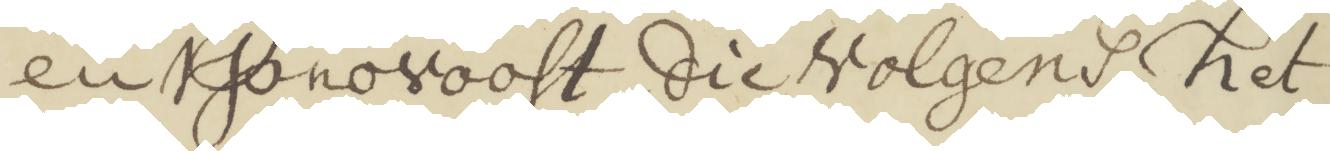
en 1 provoost die volgens het
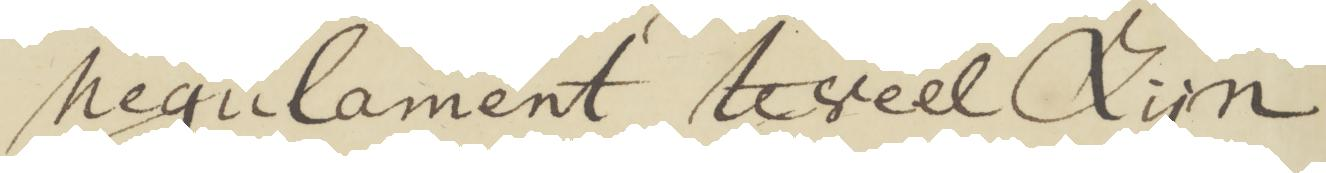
regulament teveel zijn
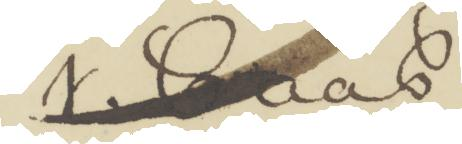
1. Baas
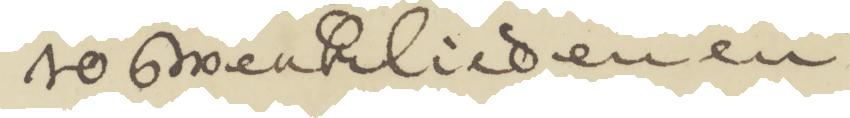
10 werklieden en
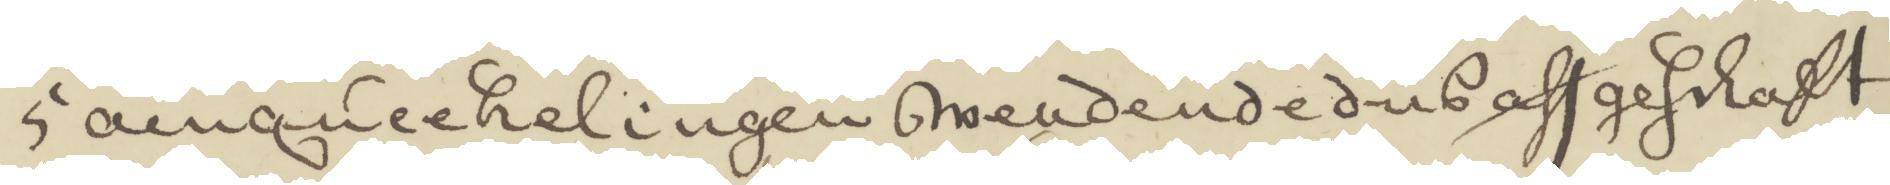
5 aenqueekelingen werdende dus affgeschaft
